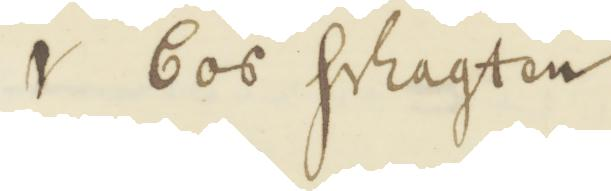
1 bos schagten
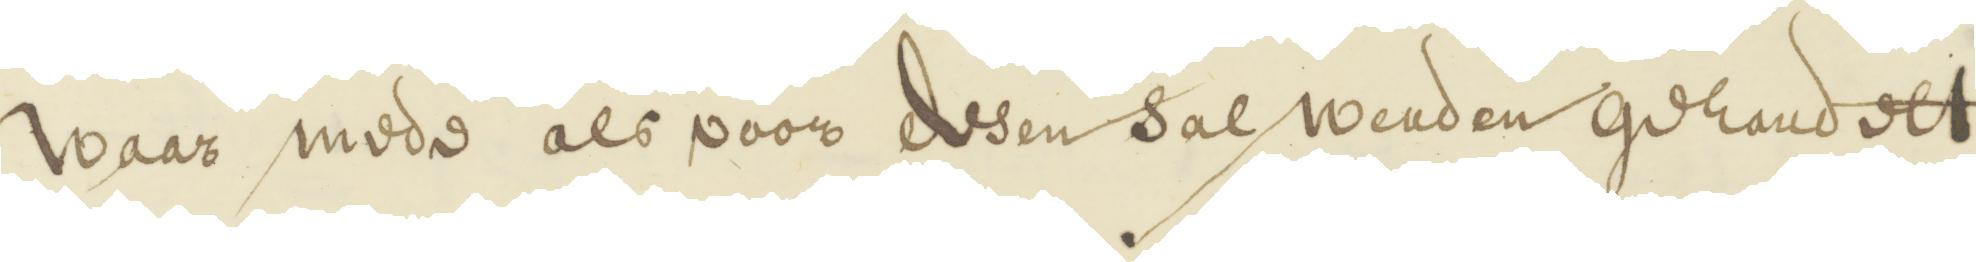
waar mede als voor desen sal werden gehandelt
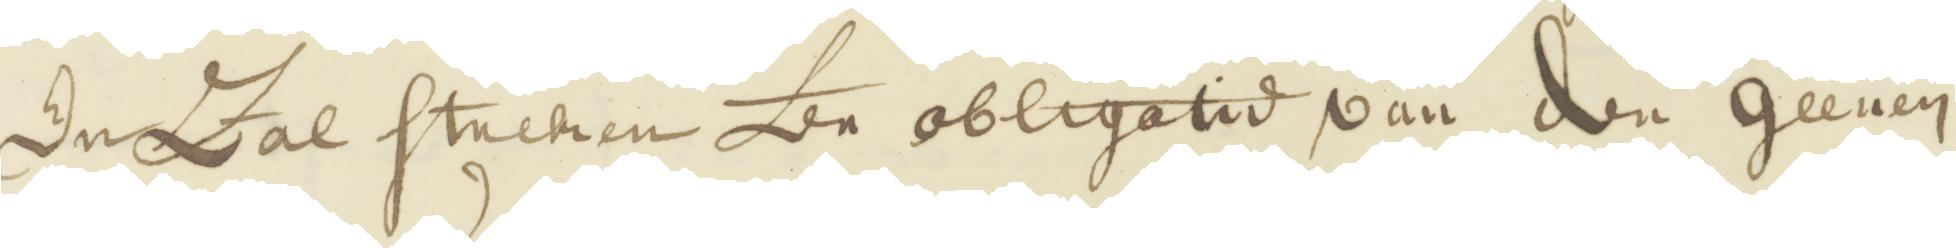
En Zal streken ter obligatie van den geenen
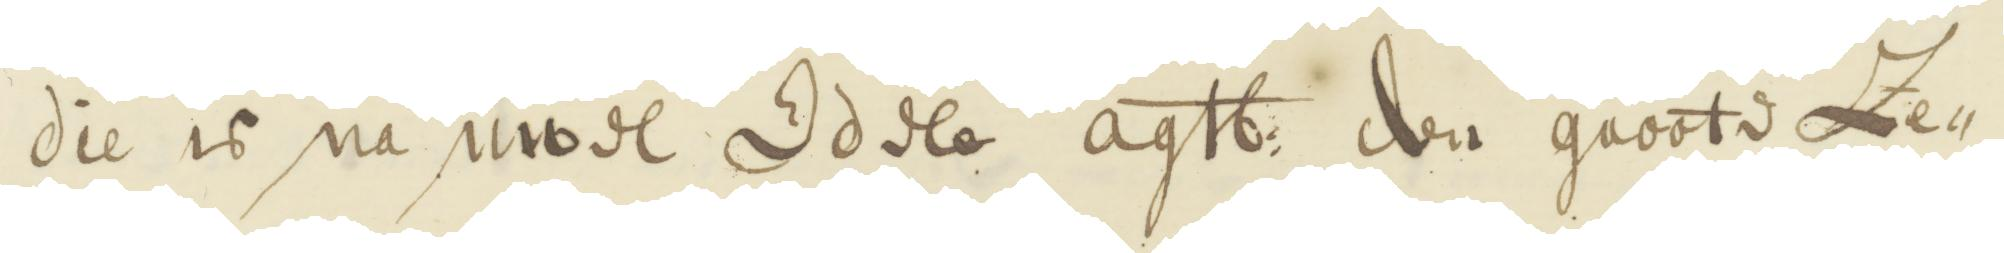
die is na uwel Edele agtb: den groote Ze
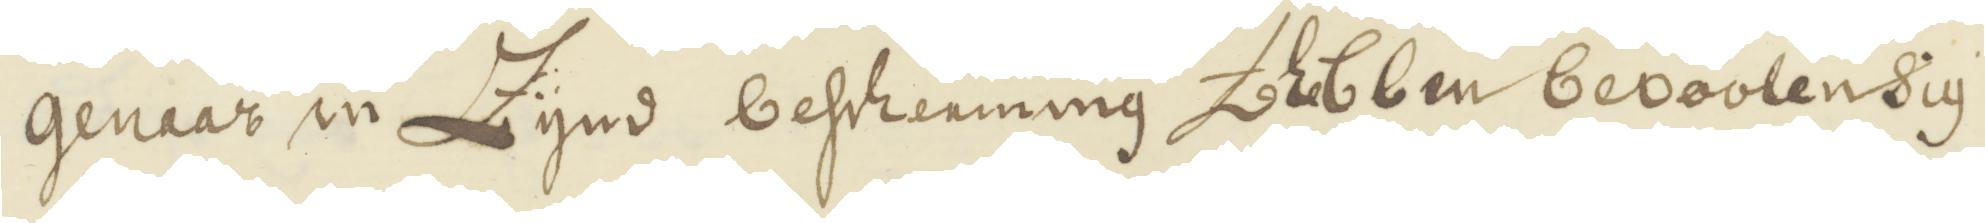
genaar in Zijne bescherming te hebben bevoolen sig
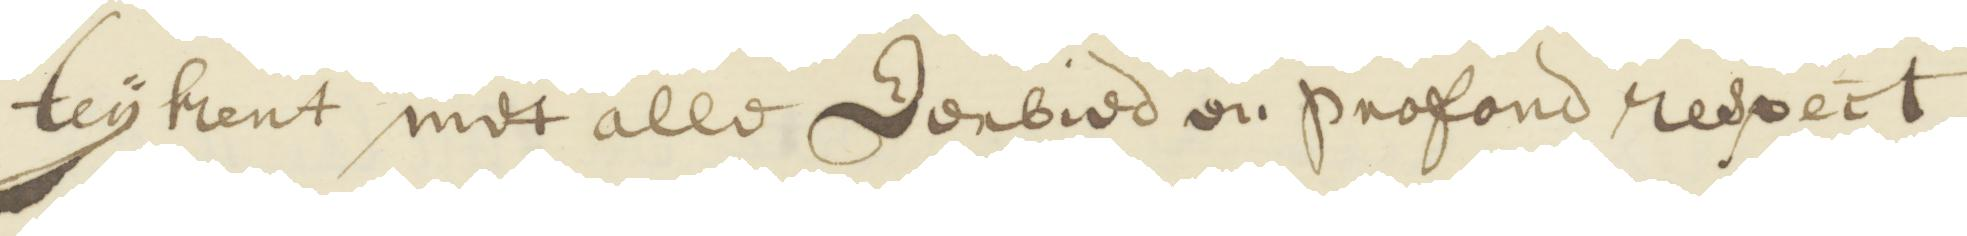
teijkent met alle Eerbied en profond respect
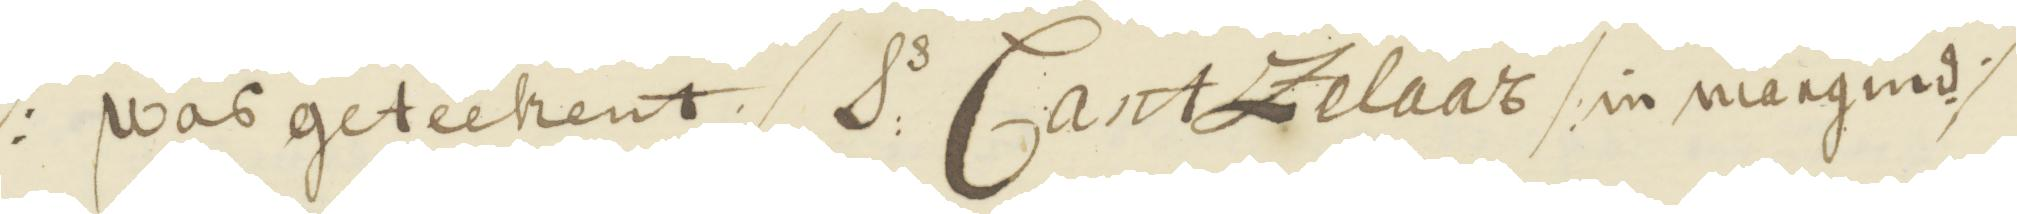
/: was geteekent:/ S:s Cantzelaar /:in margine:/
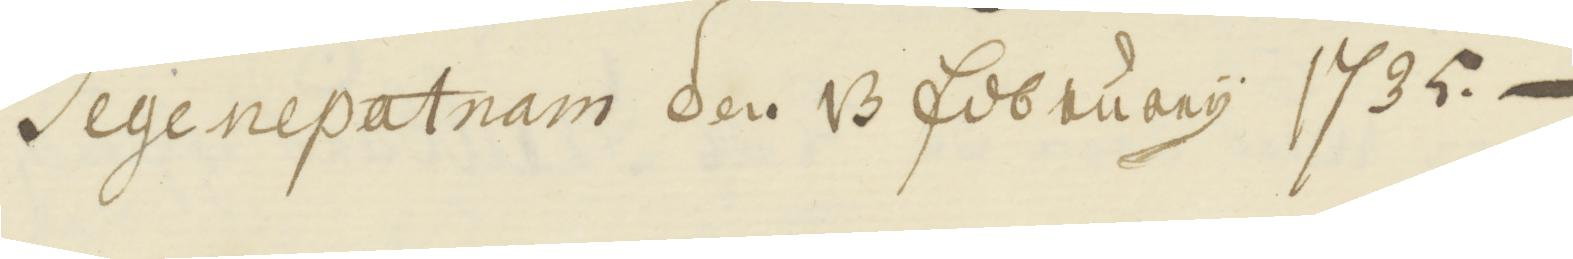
Tegenepatnam den 13 februarij 1735. —
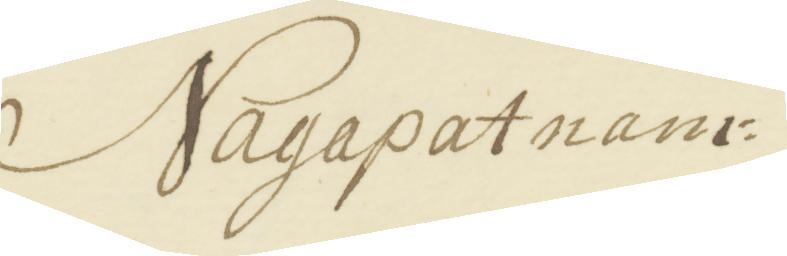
Nagapatnam:
